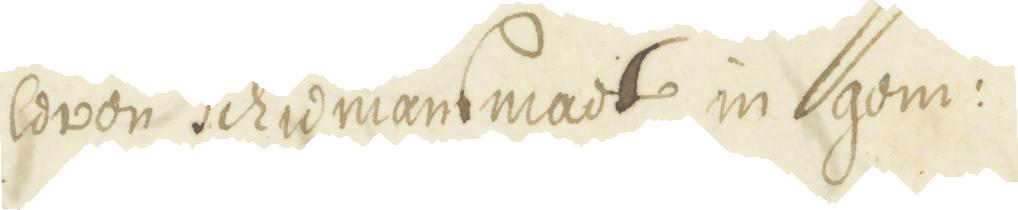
leven schiemansmaet in gem:
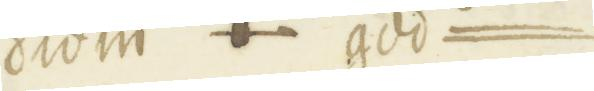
dienst ged=e
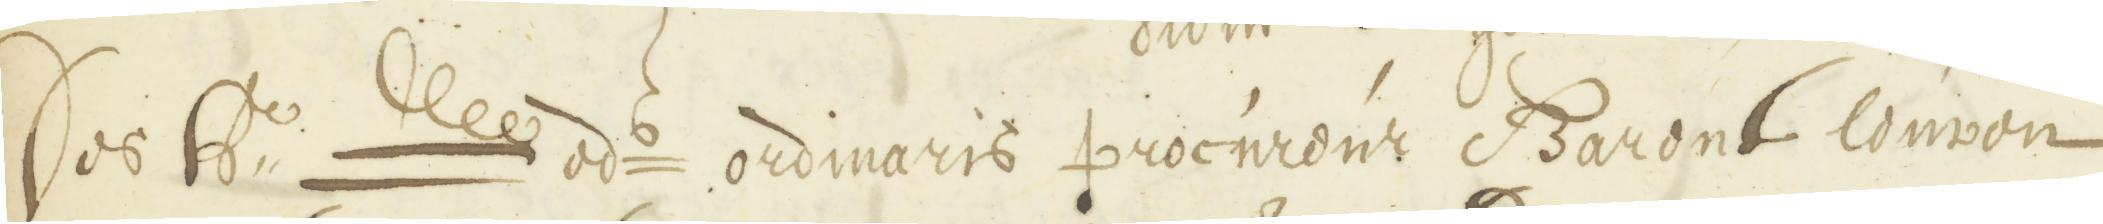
Des H=r Ged=s ordinaris procureur Barent leuven
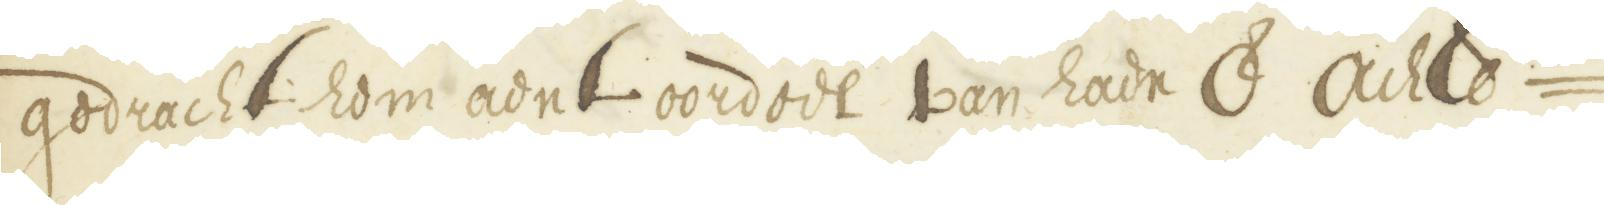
gedracht: hem aen t oordeel van haer E Achtb=re
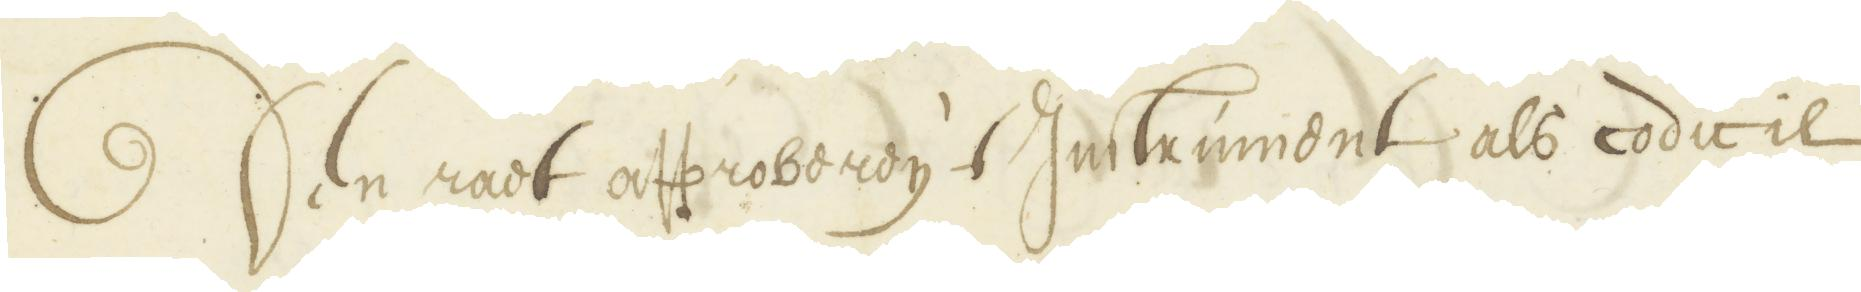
Den raet approberen 't Jnstrument als codicil
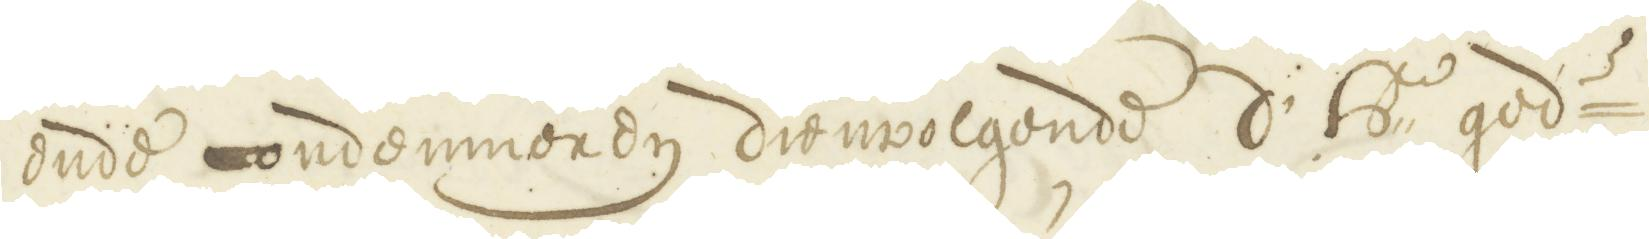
ende condemneren dienvolgende d’ H„r ged=e
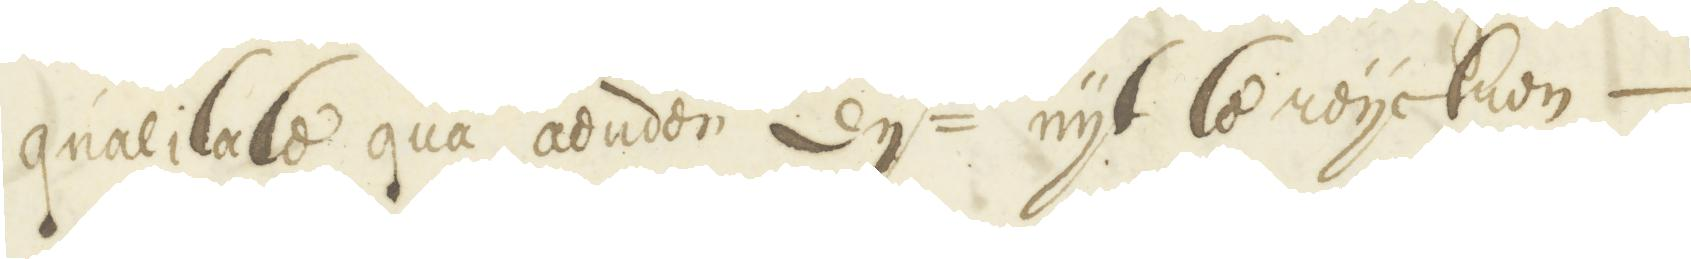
qualitate qua aenden Eij=r uijt te reijcken —
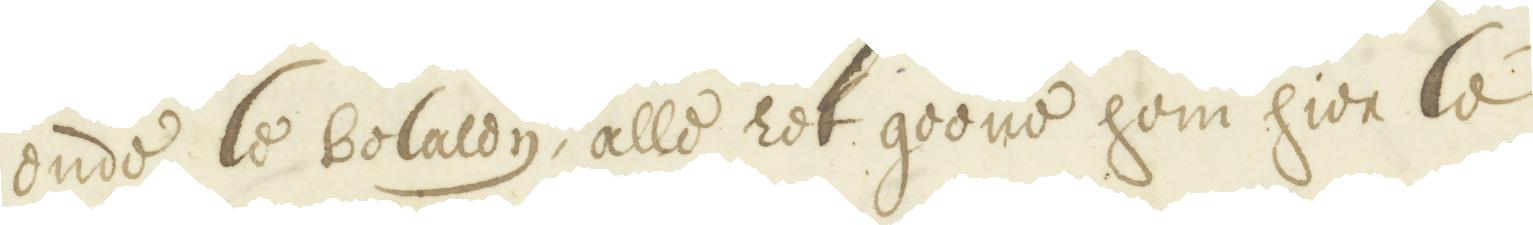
ende te betalen, alle het geene hem hier te
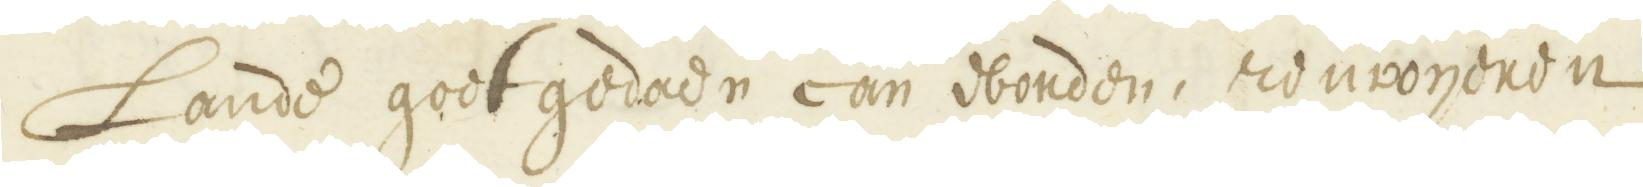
Lande goet gedaen can worden, renvoijeren
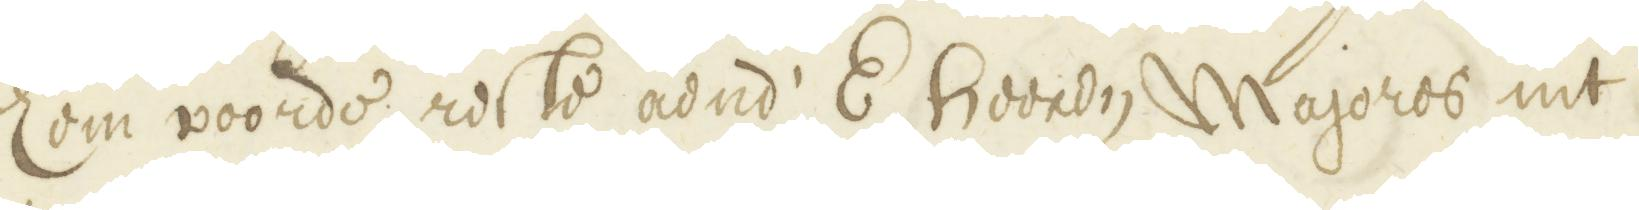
hem voorde reste aend’ E Heeren Majeres int
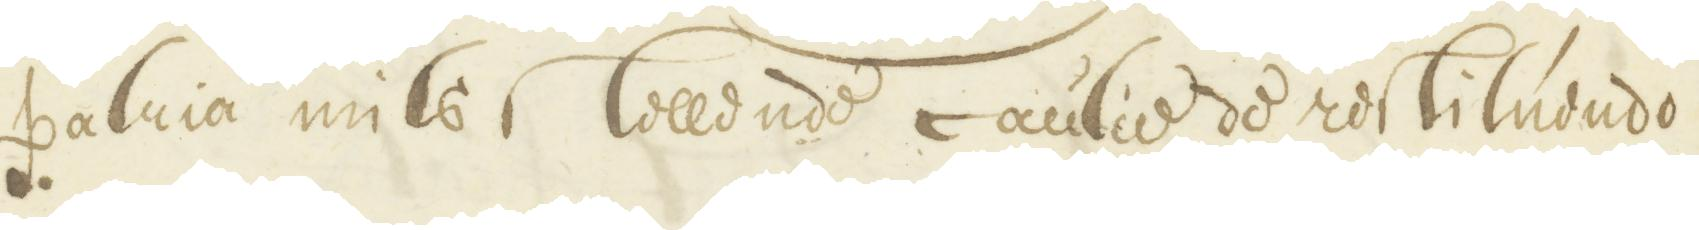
patria mits stellende cautie de restituendo
